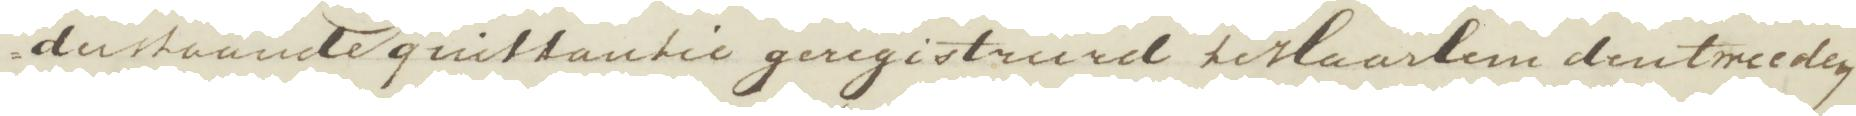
der staande quittantie geregistreerd te Haarlem den tweeden
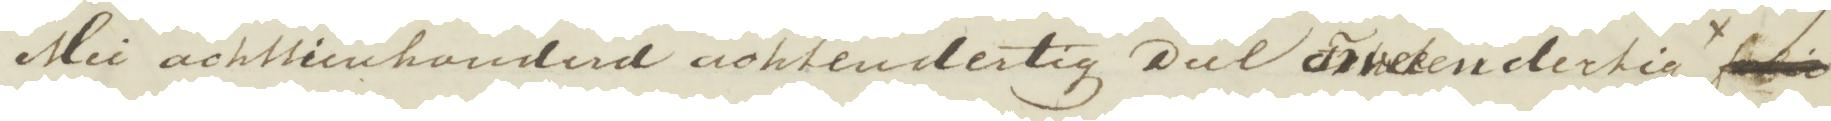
Mei achttienhonderd achtendertig deel Tweeen dertig xfolio
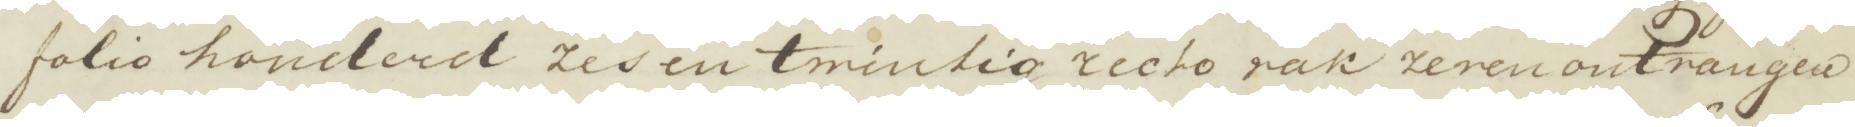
folio honderd zes en twintig recto vak zeven ontvangen
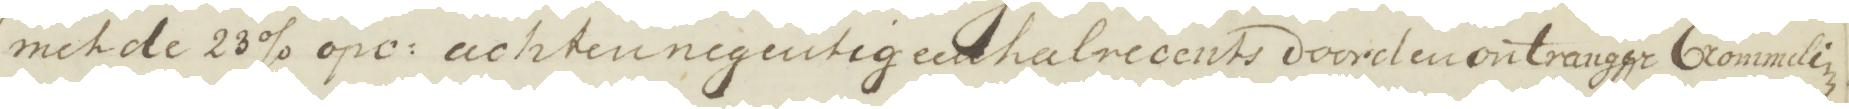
met de 23 % opc: achtennegentig een halve cents door den ontvanger Crommelin
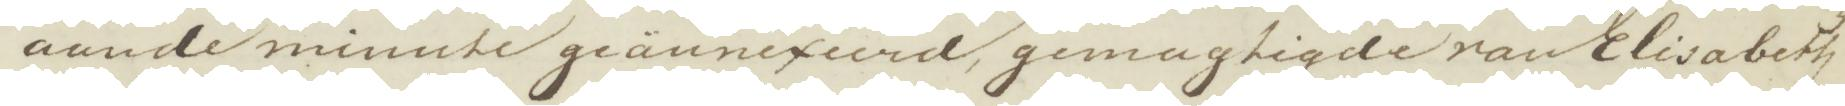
aan de minute geannexeerd, gemagtigde van Elisabeth
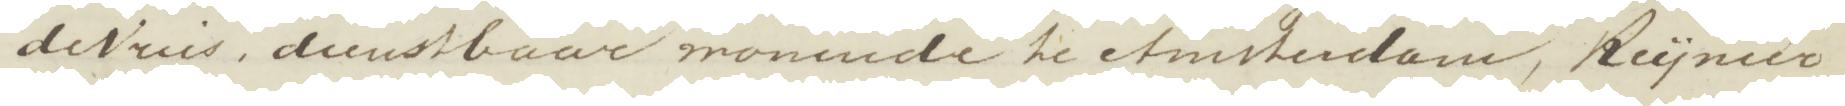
deVries, dienstbaar wonende te Amsterdam, Reijnier
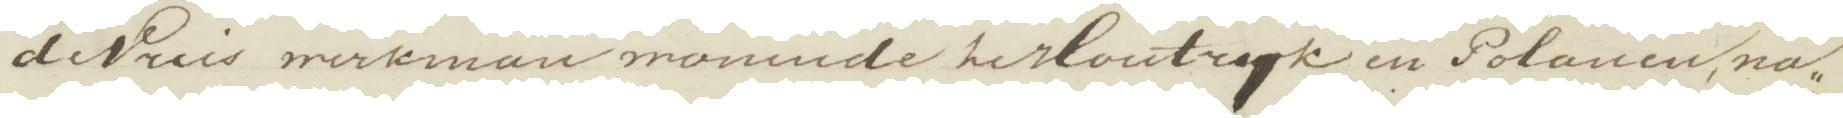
deVries werkman wonende te Houtrijk en Polanen, na„
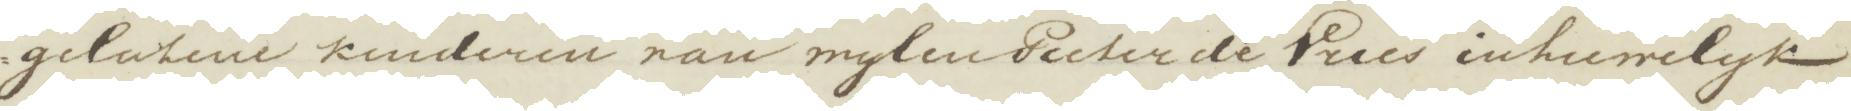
gelatene kinderen van wijlen Pieter de Vries inhuwelyk
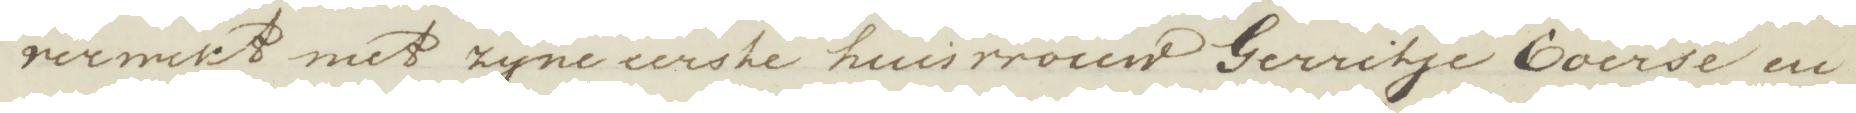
verwekt met zyne eerste huisvrouw Gerritje Coerse en
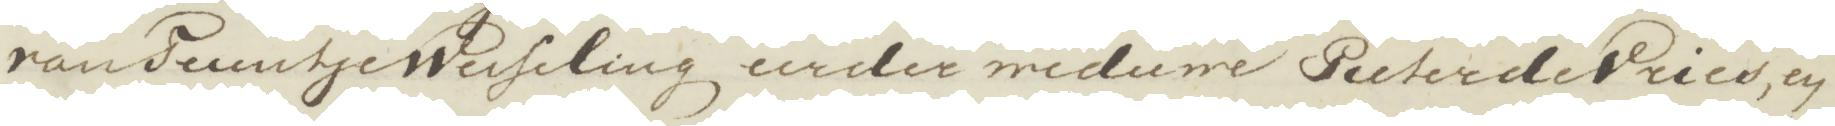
van Teuntje Wesseling eerder weduwe Pieter de Vries, en
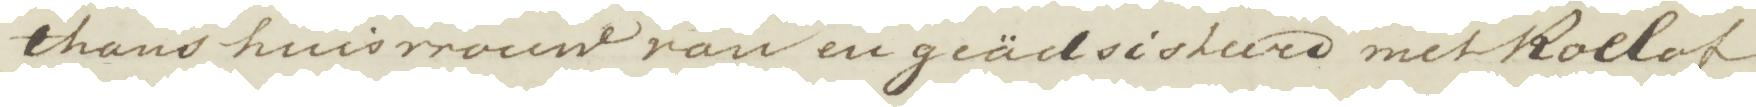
thans huisvrouw van en geadsisteerd met Roelof
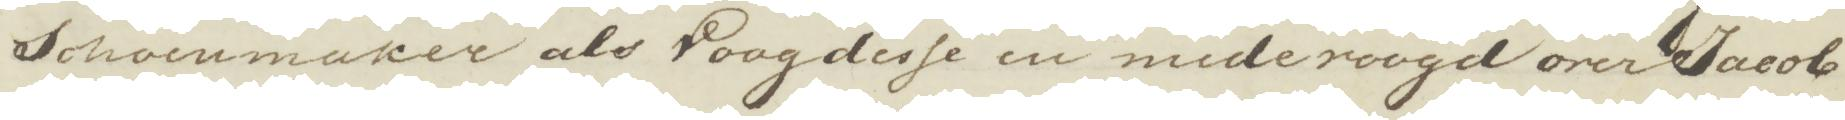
Schoenmaker als Voogdesse en nude voogd over Iacob
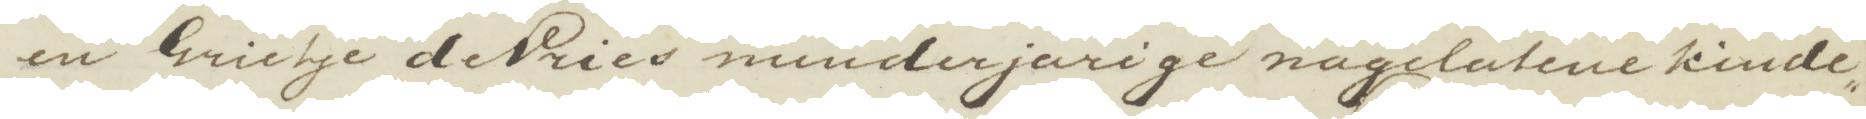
en Grietje de Vries minderjarige nagelatene kinde„
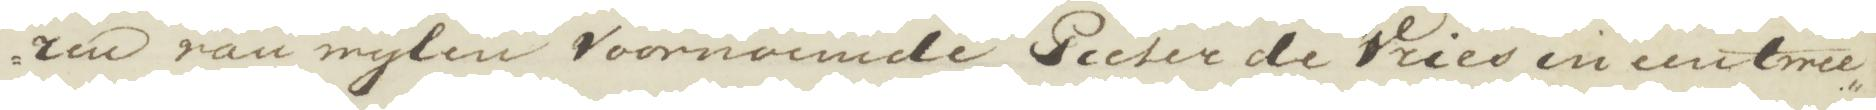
=ren van wylen voornoemde Pieter de Vries in een twee„
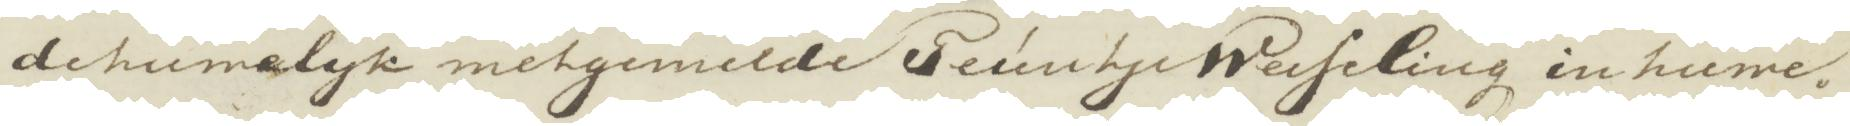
de huwelijk met gemelde Teuntje Wesseling in huwe„
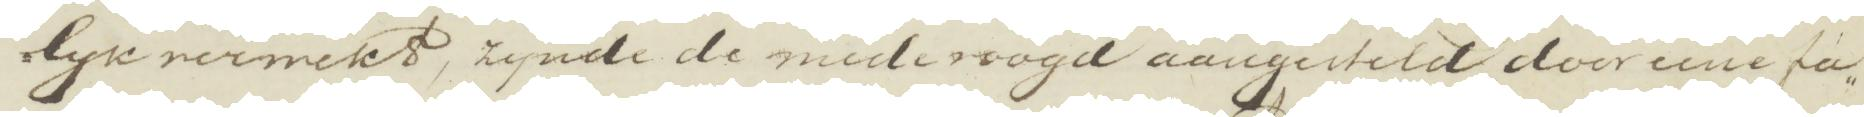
=lyk verwekt, zynde de medevoogd aangesteld door eene fa
